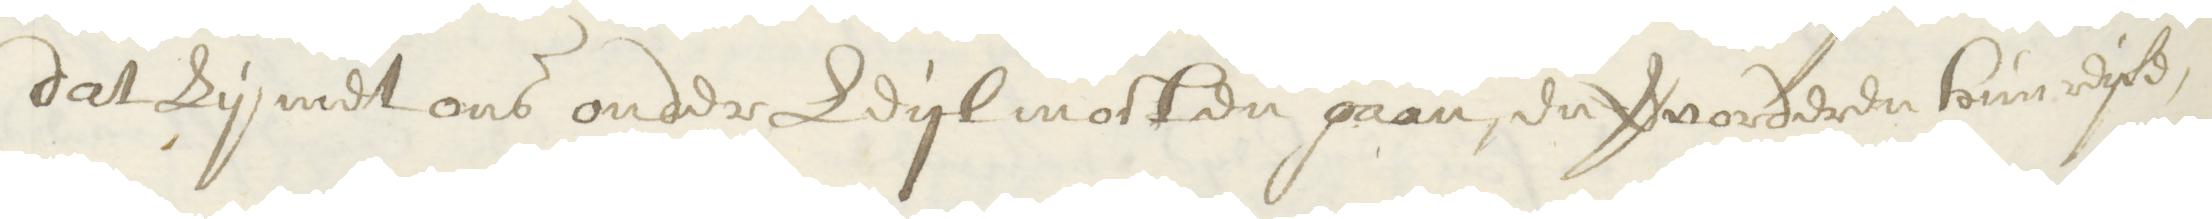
dat zij met ons onder zeijl mosten gaan, en vervorderen hun wijse,
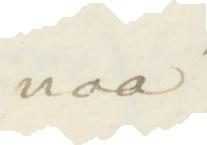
naa
